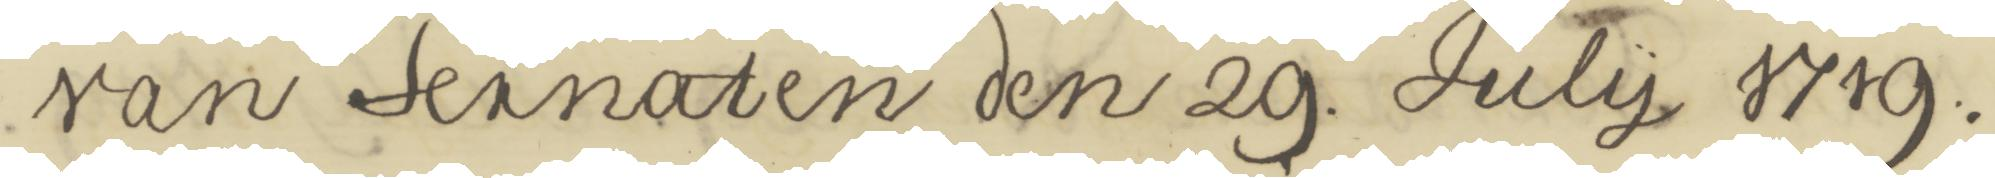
van Ternaten den 29. Iulij 1719.
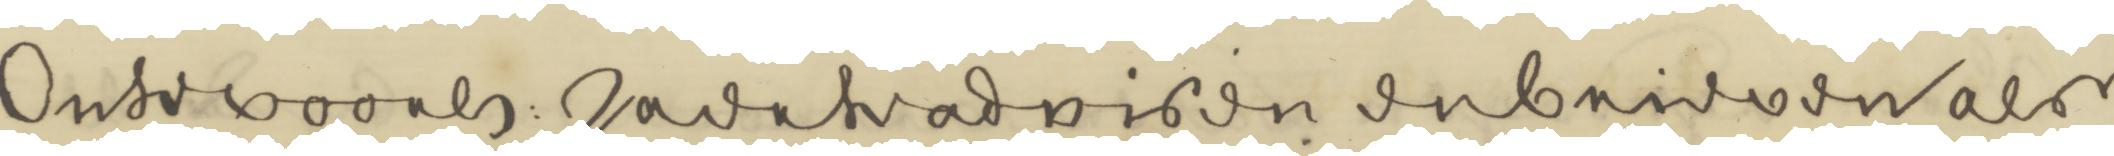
Onse voorl: Jaerse advisen en brieven als
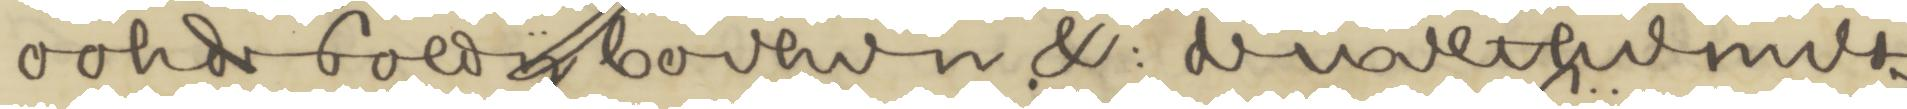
ook de soldij boeken &: de welcke met
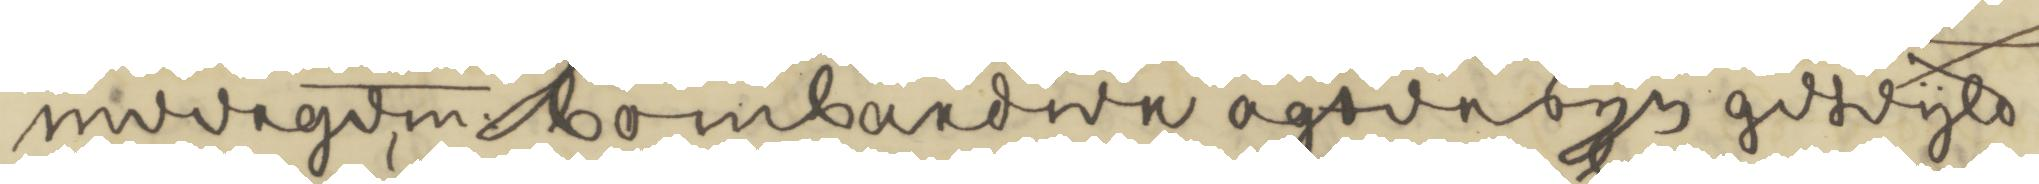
meergem: bombardier agter sijn geseijld
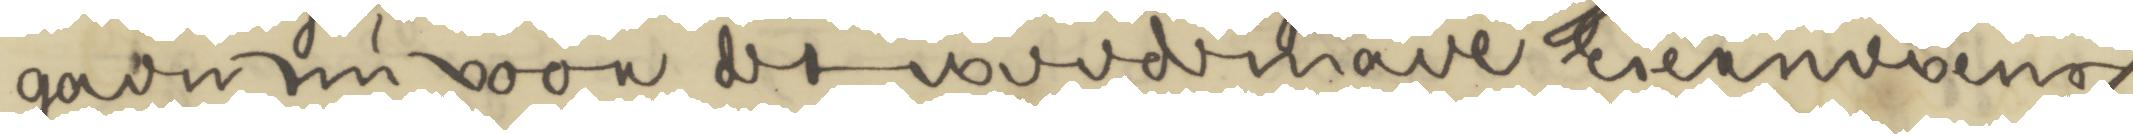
gaen nu voor de tweedemael hier nevens
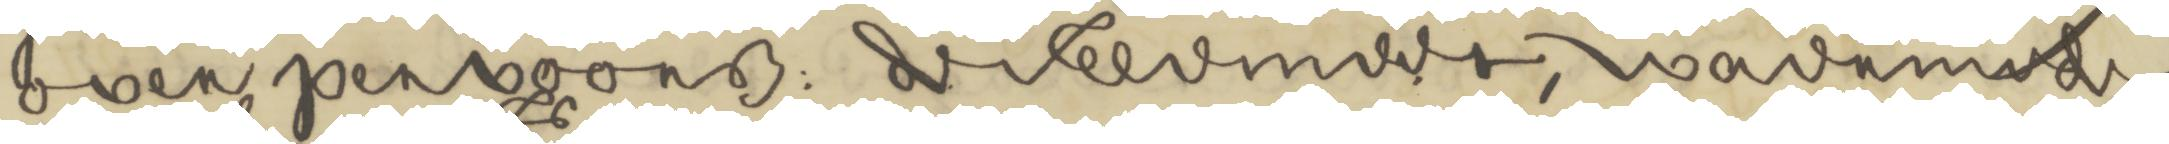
over per voorsz: de Ellemeet, waermede
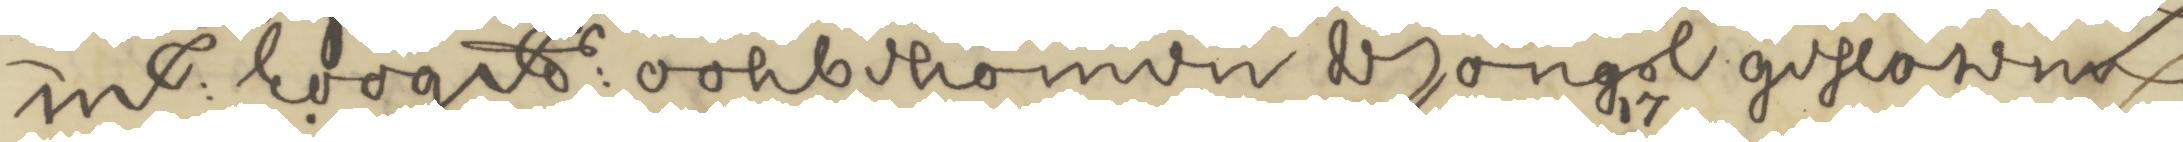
uE: hoog Ed:s ook bekomen de jongst geslotene
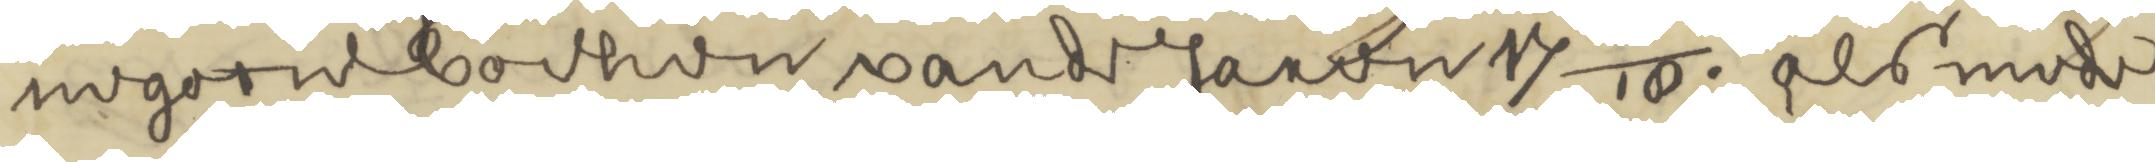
negotieboeken van de Jaren 17 17/18. als mede
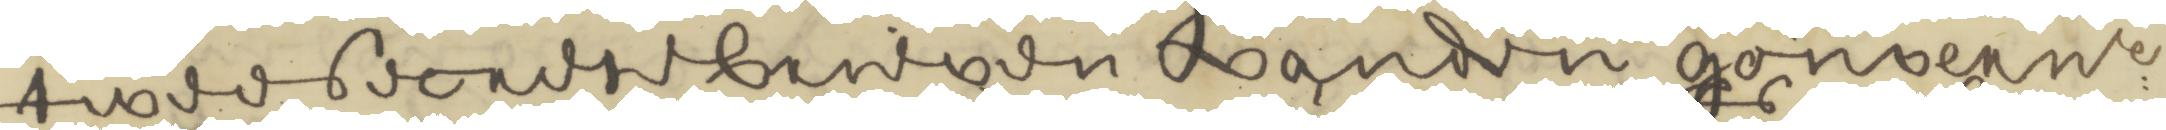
twee secrete brieven van den gouvern:r
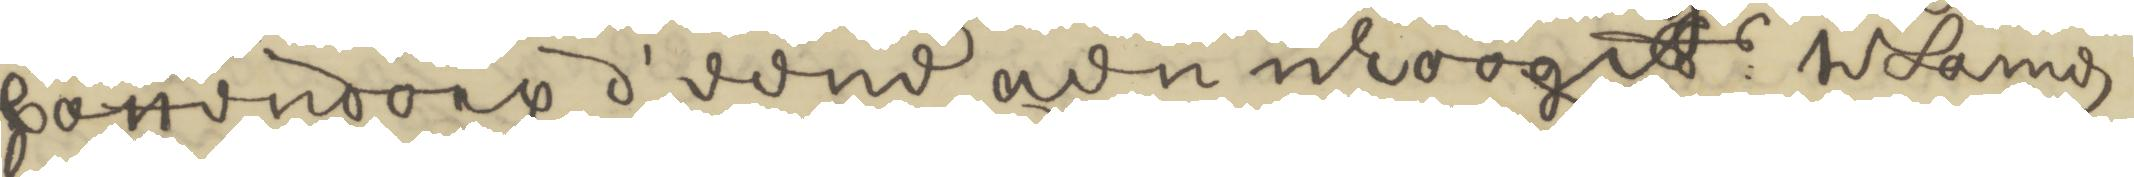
bottendorp d'eene aen uhoog Ed:s te samen
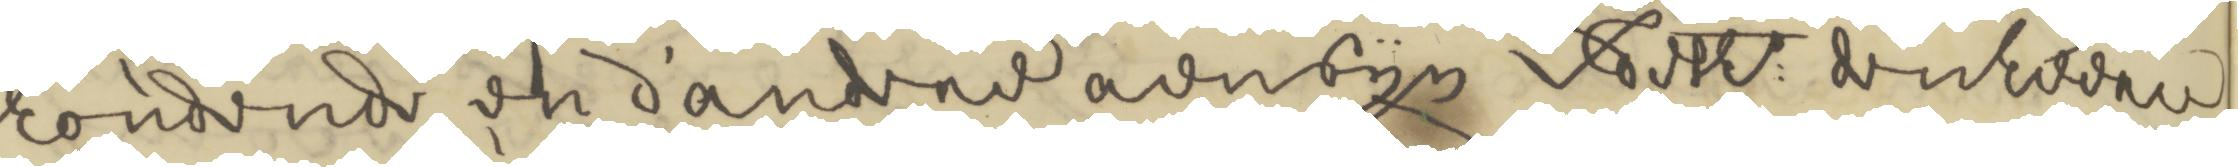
houdende en d'andere aen sijn Edelh:t den heere
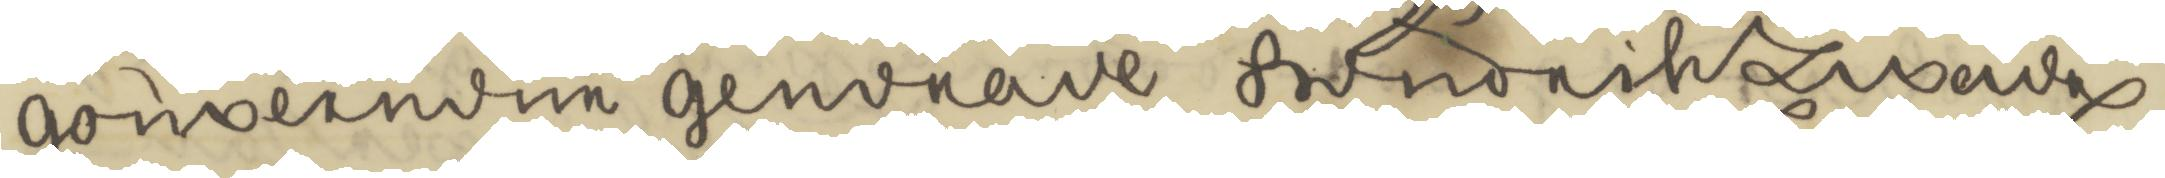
gouverneur generael Hendrik Zwaer
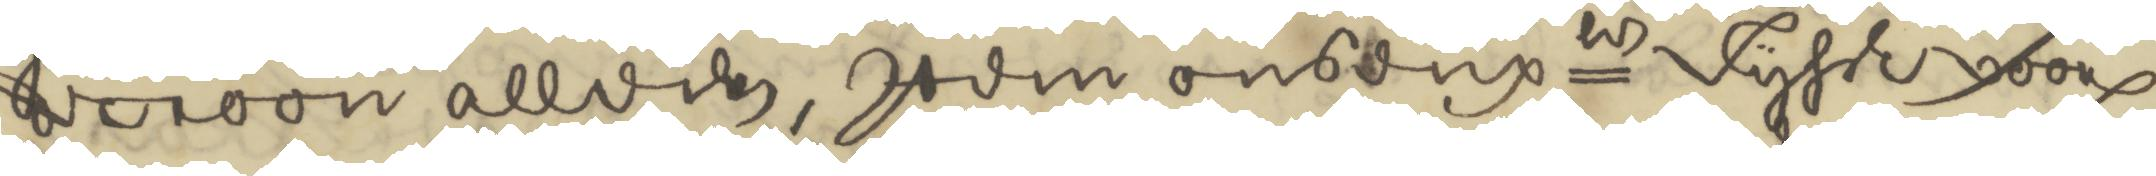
decroon alleen, jtem onsen p=len Eijsch voor
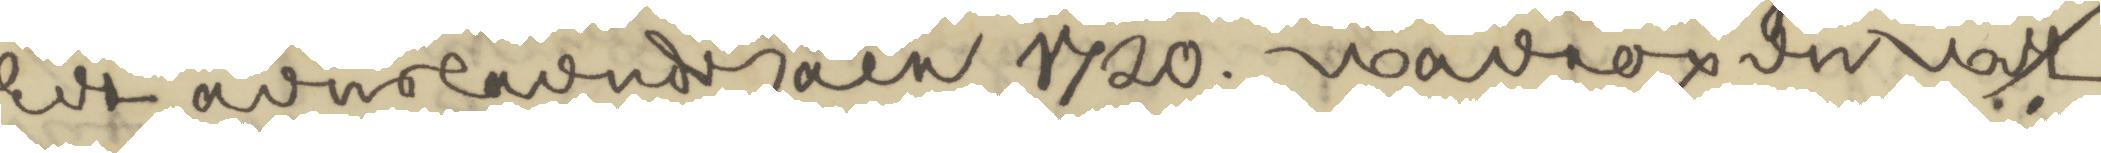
het aenstaende jaer 1720. waer op en wel
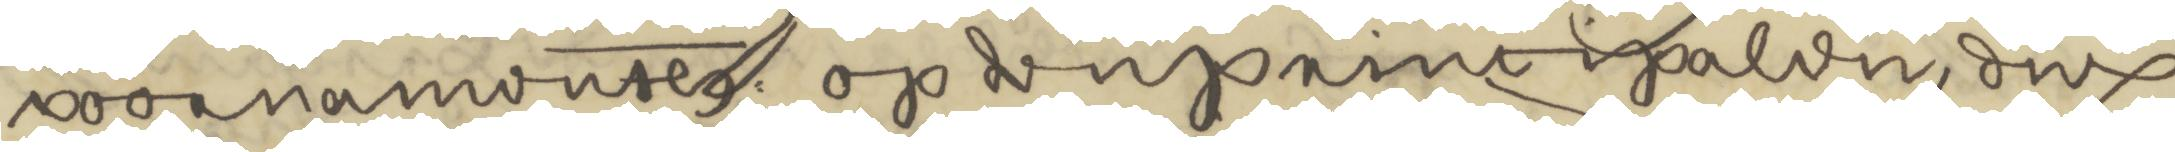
voornamentlijk op den principalen, die
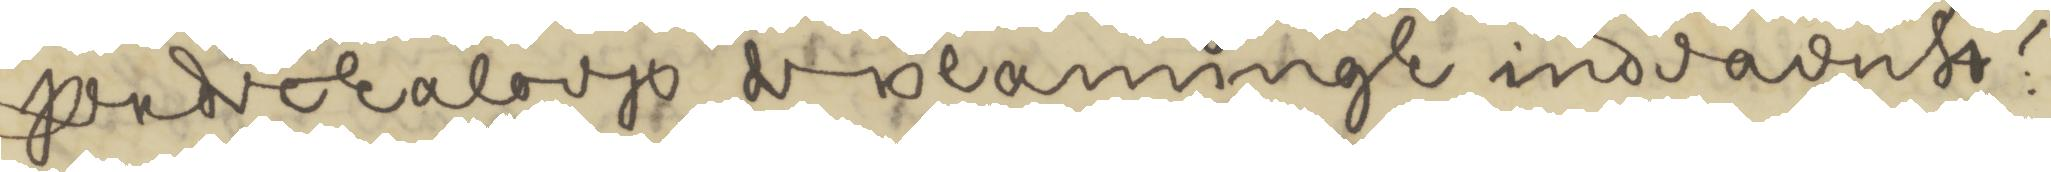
per de chaloep de vlamingh in de aenst:'
